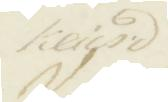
keurd
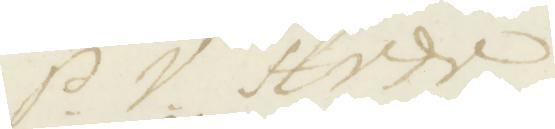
P. V. Hvw
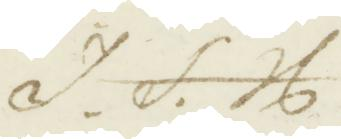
J. S. H
